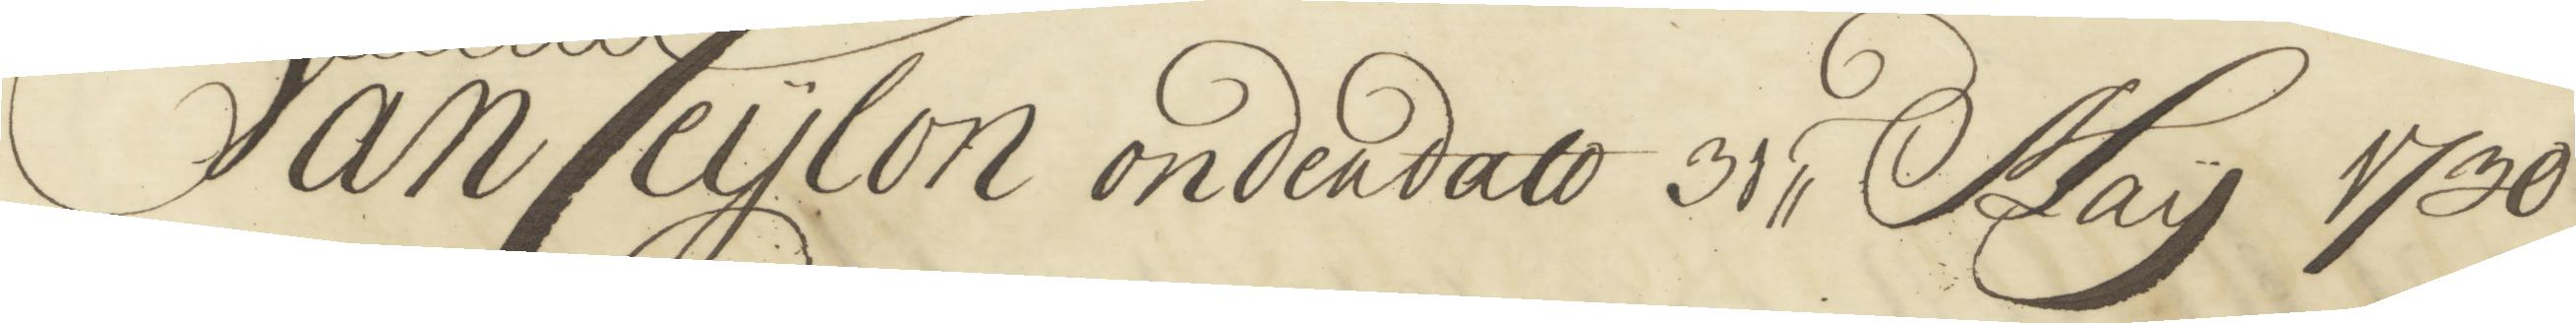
Van Ceijlon onder dato 31„e Maij 1730
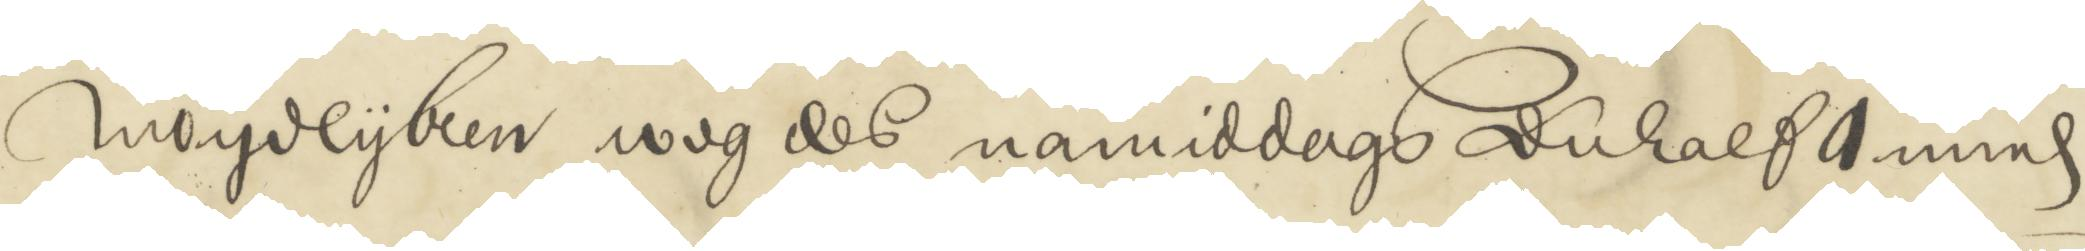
moijelijken weg des namiddags ten half 4 uuren
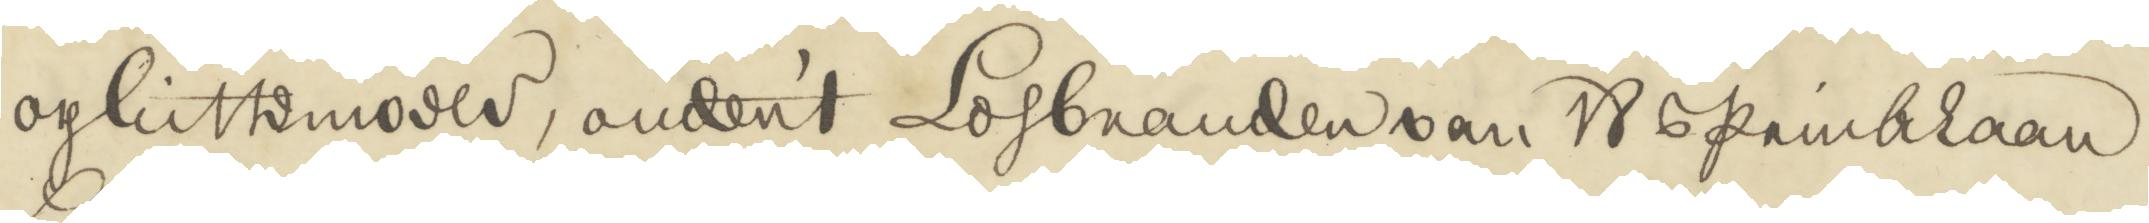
op hittemoele, onder ’t Losbranden van 18 sprinkhaan
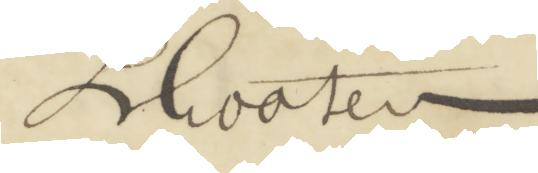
schooten
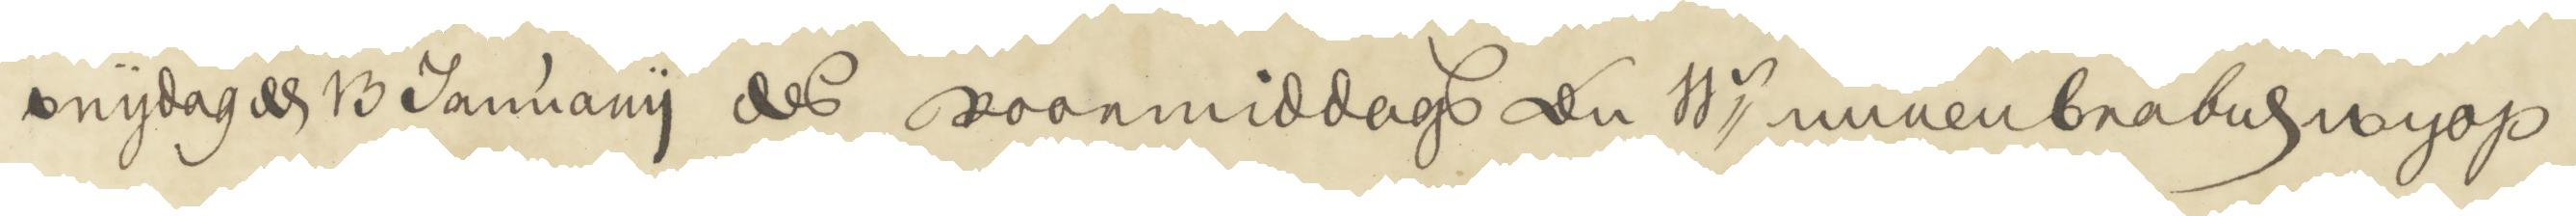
vrijdag den 13 Ianuarij des voormiddags ten 11„en uuren braken wy op
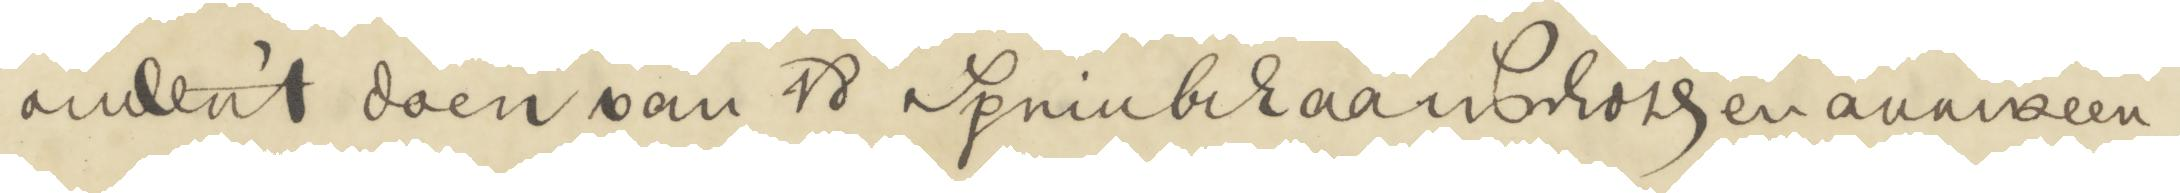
onder ’t doen van 18 Sprinkhaanschoten en arriveer
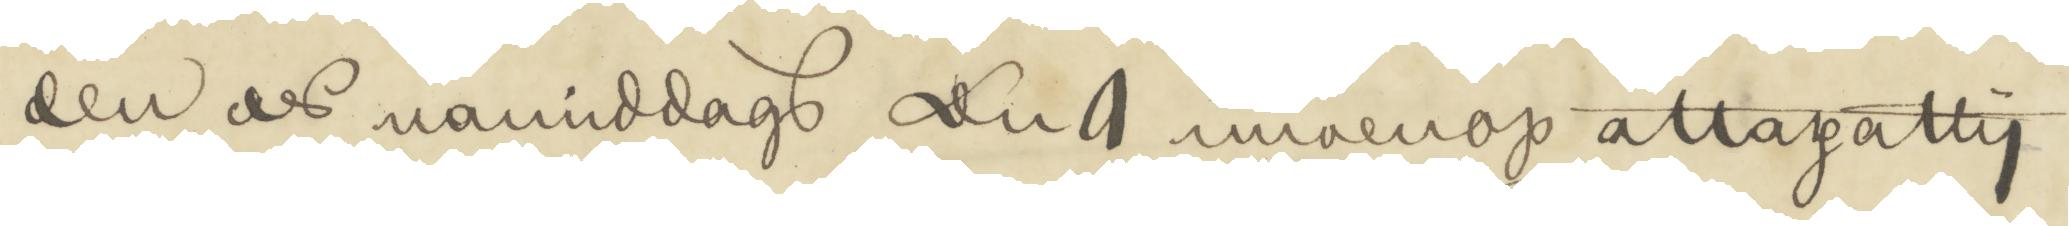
den des nanuddags ten 4 uuren op attapattij
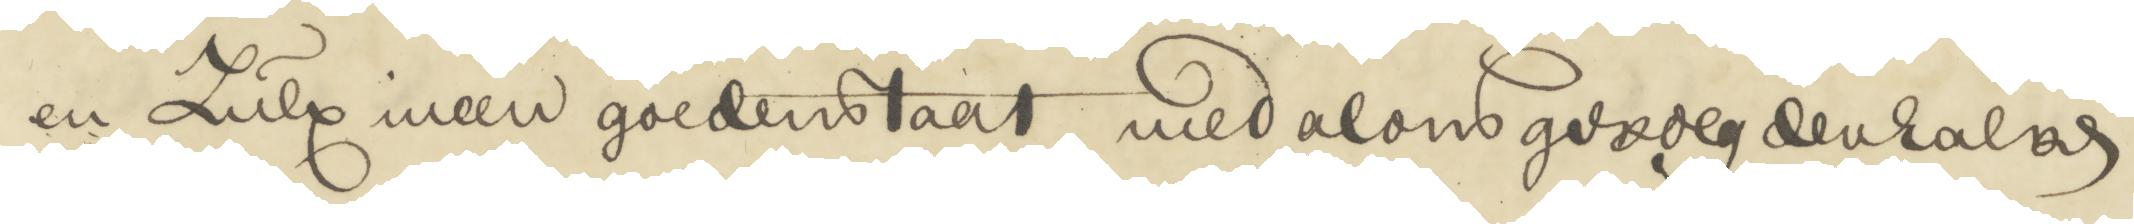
en Zulx ineen goedenstaat med al ons gevolg derhalven
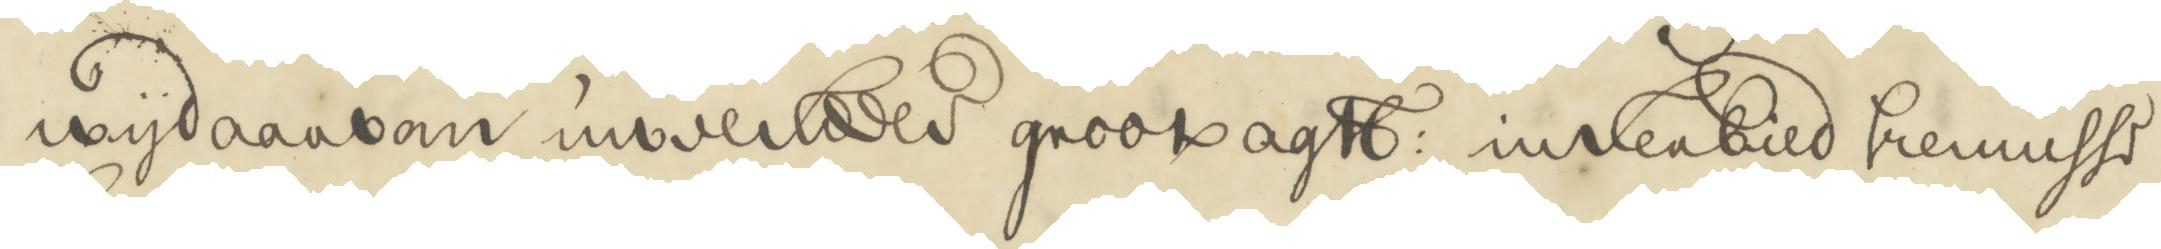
wij daarvan uwel Edele groot agtb: in Eerbied kennisse
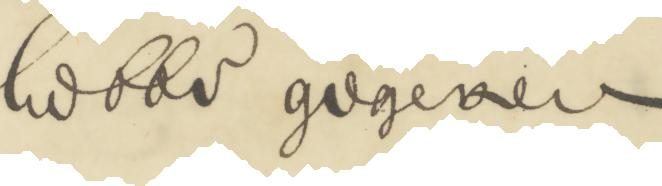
hebbe gegeven
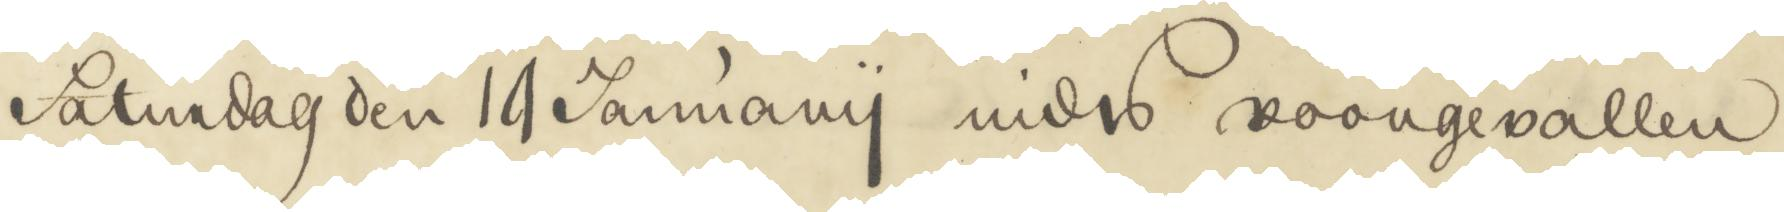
Saturdag den 14 Ianuarij niets voorgevallen
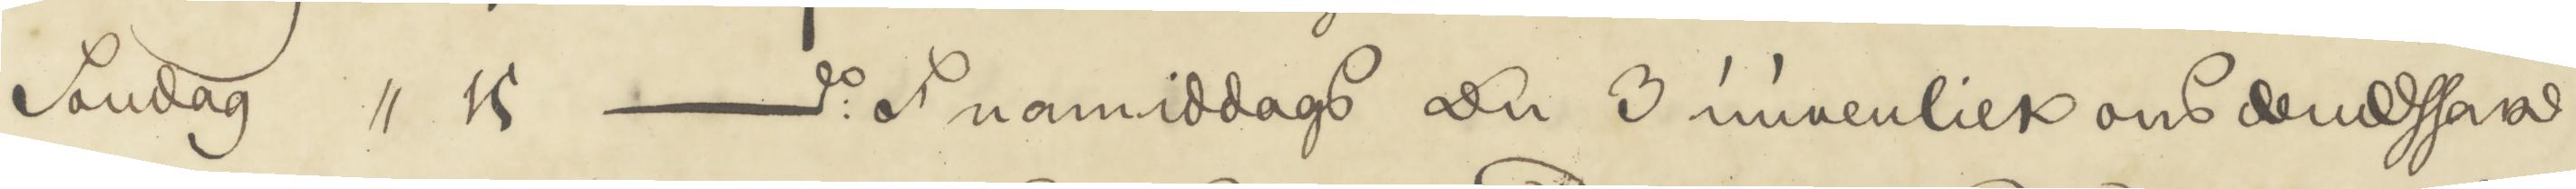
Sondag „ 15 d:o S' namiddags ten 3 uuren liet ons den dessave
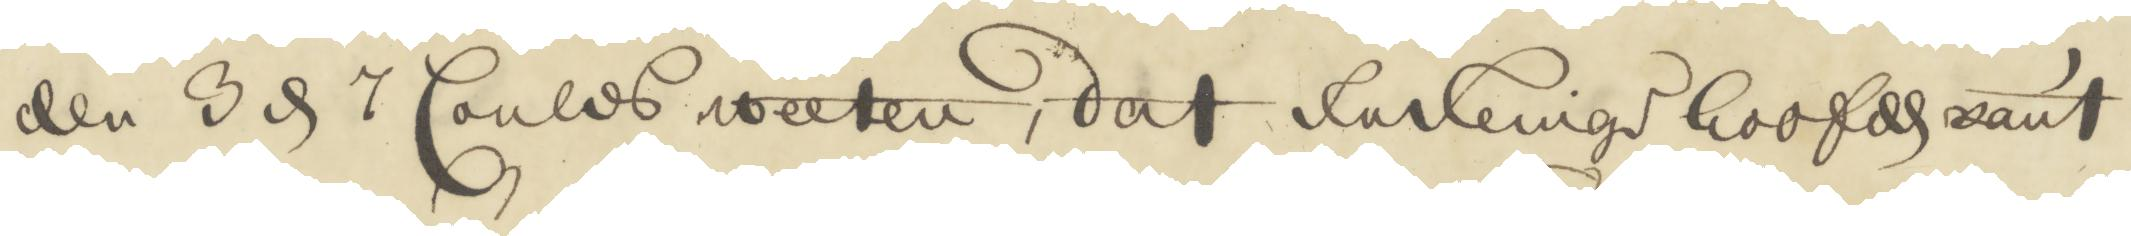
der 3 en 7 Corles weeten, dat Er Eenige hoofden van ’t
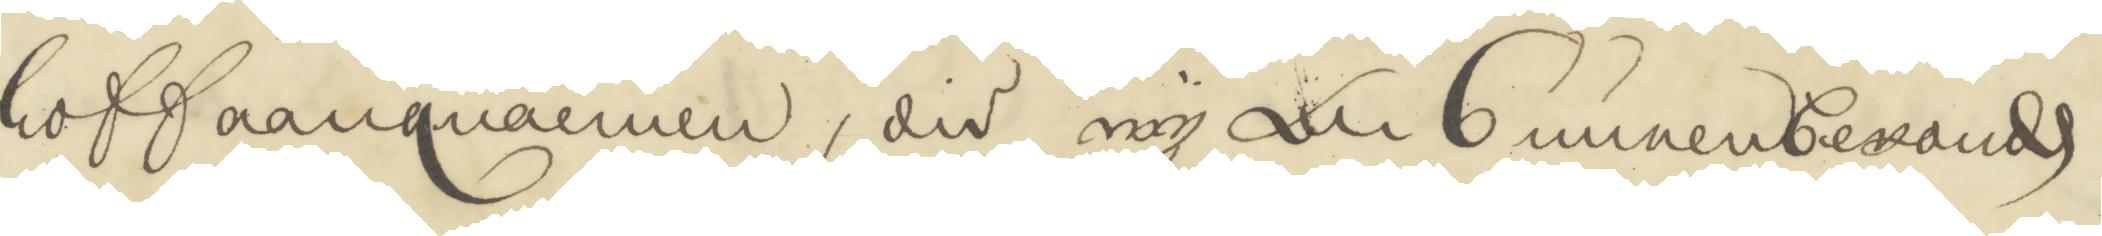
hoff aanquaemen, die wij ten 6 uuren bevonden
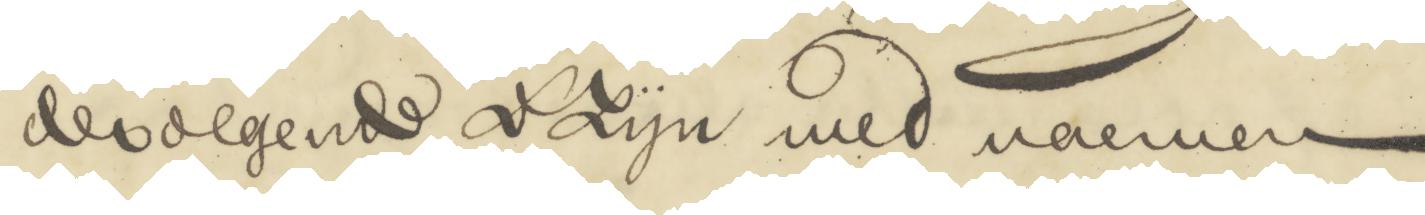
de volgende te zijn med naemen
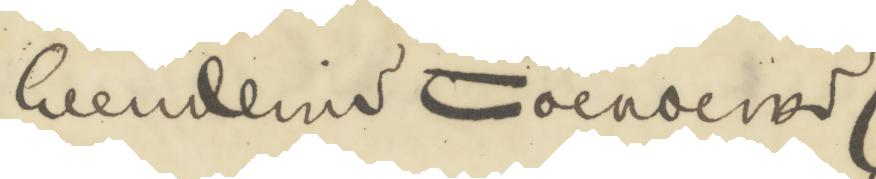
heendenie Coeroewe,
